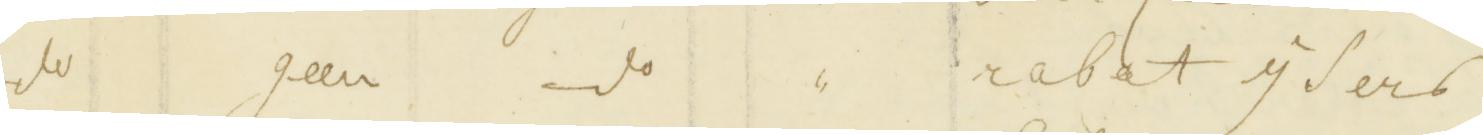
do geen do „ rabat ijsers
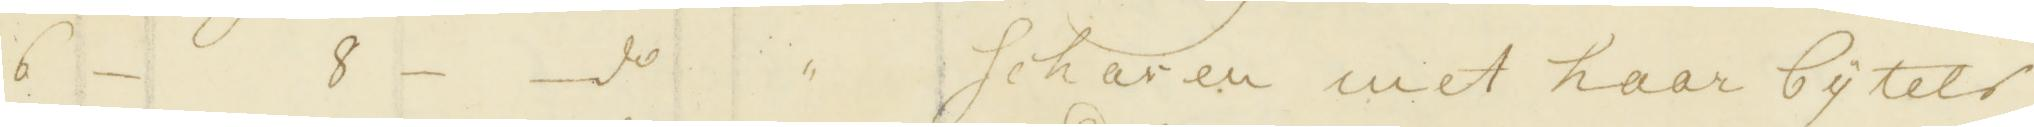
6 — 8 — do „ scharen met haar bijtels
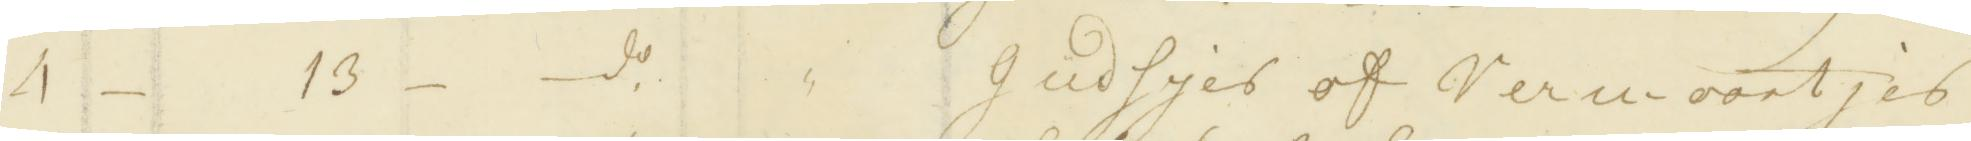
4 — 13 — d„o gudsijes of verw oortjes
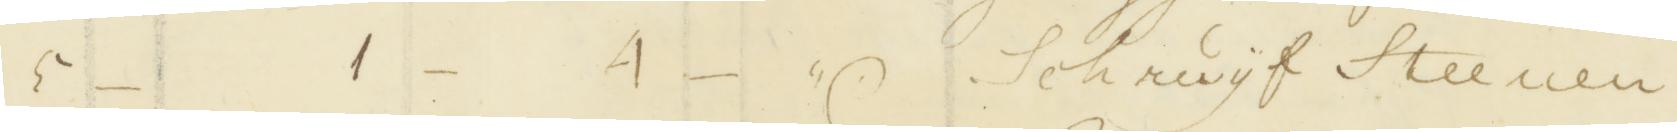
5 — 1 — 4 — „ schruijf steenen
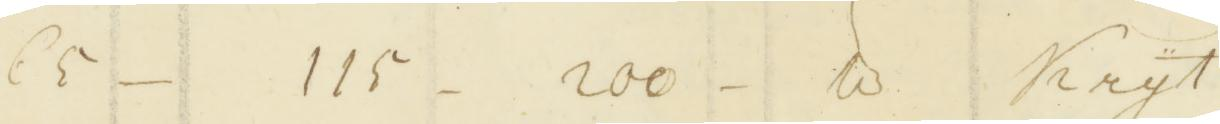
65 — 115 - 200 - lb Krijt
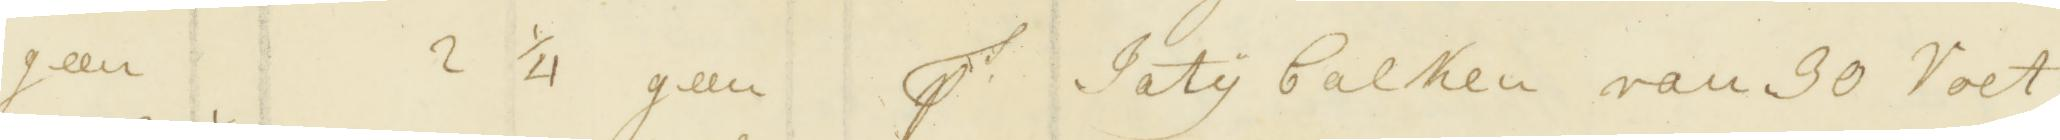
geen 2¼ geen p.s Iatij balken van 30 Voet
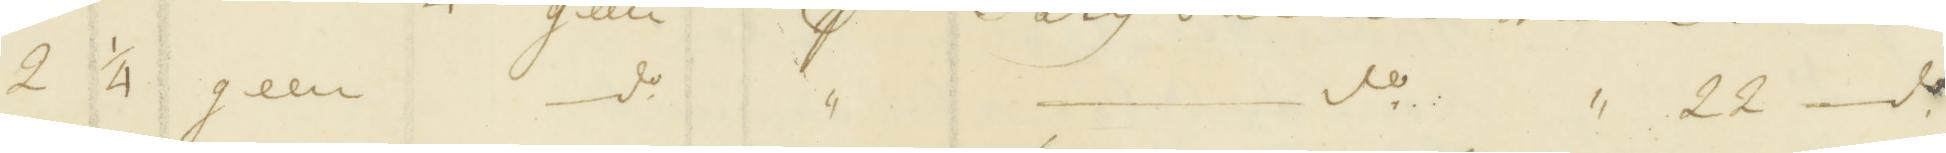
2 ¼ een d.o „ — d„o „ 22 d.o
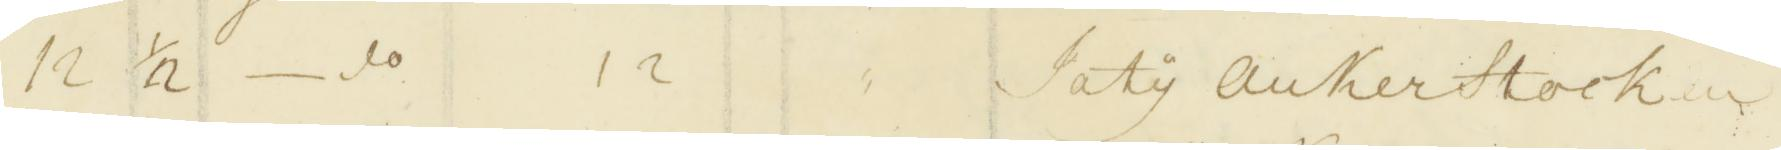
12 ½ — do 12 „ Iatij ankerstocken
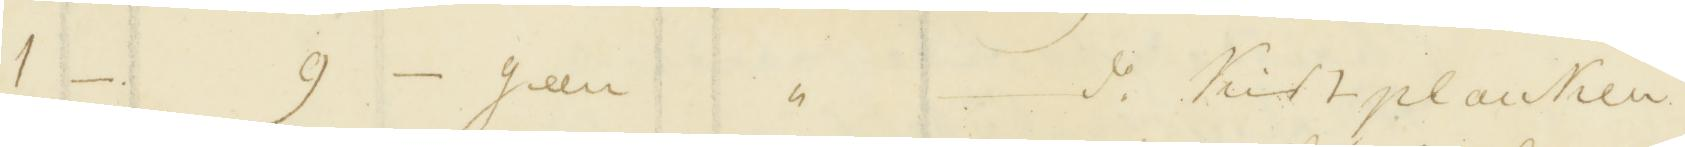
1 — 9 — geen „ do. kistplanken.
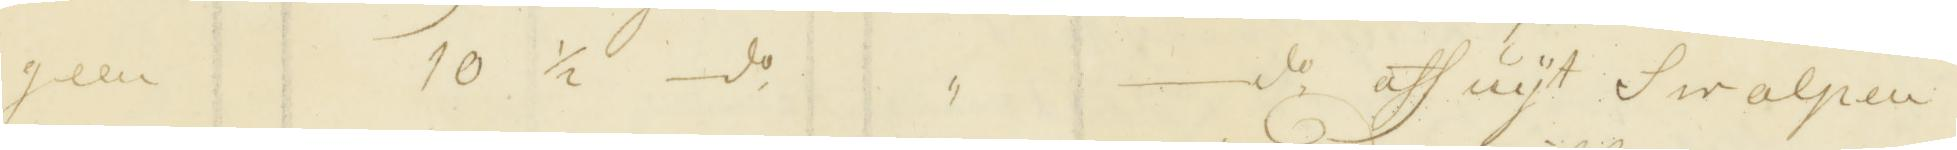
geen 10 ½ d.o „ d„o aff uijt swalpen
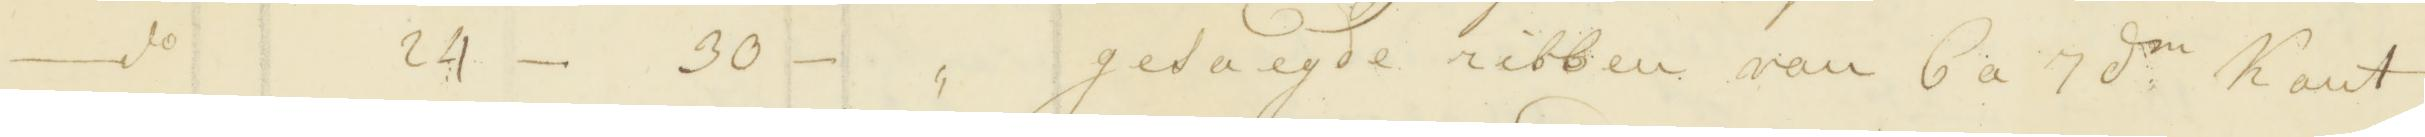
do 24 — 30 — „ gesaegde ribben van 6 a 7 d„m kant
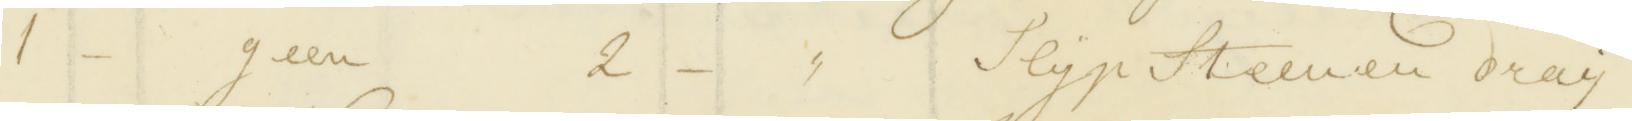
1 — geen 2 — „ slijp steenen draij
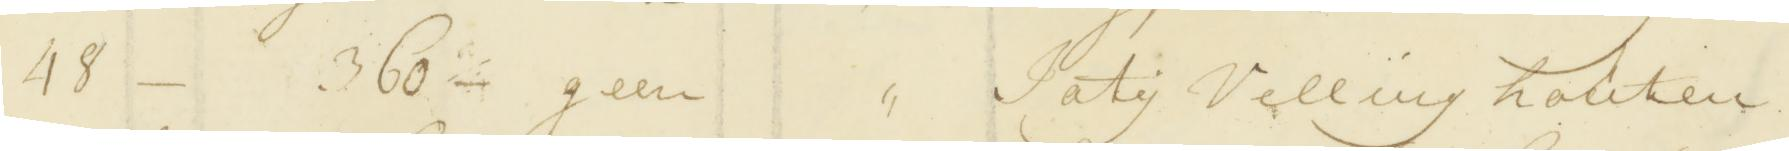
48 — 360 — geen „ Iatij velling houten
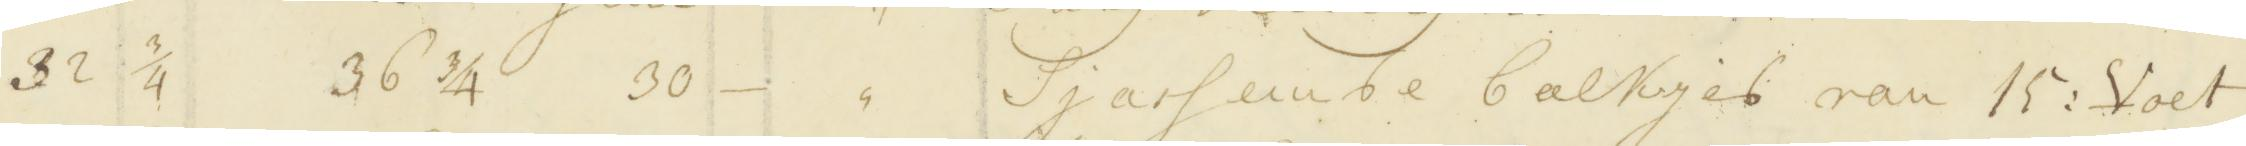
32¾ 36¾ 30 — „ Sjassembe balkjes van 15: Voet
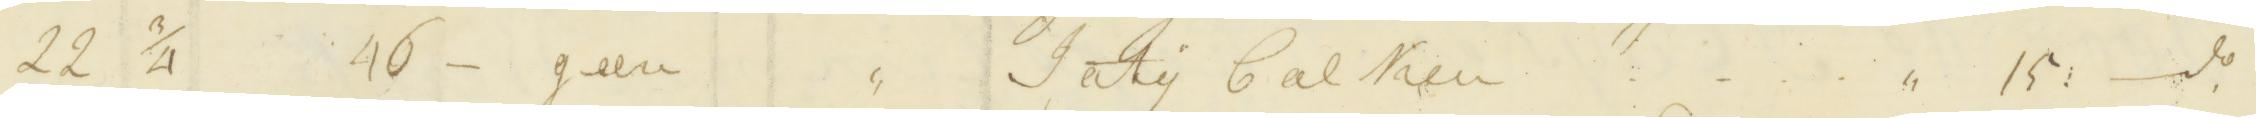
22¾ 46 — geen „ Iatij balken - - - - „ 15: d.o
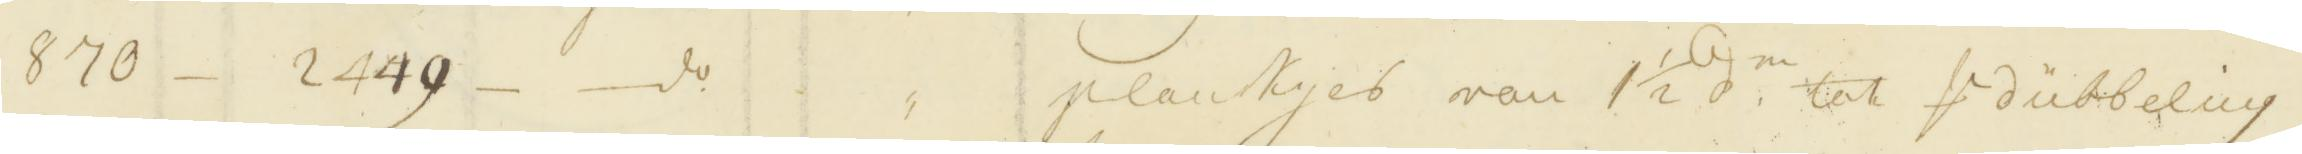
870 — 2449 — d.o „ plankjes van 1½ d.m tot sedubbeling
